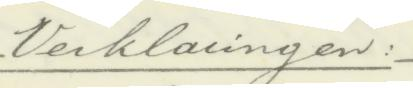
Verklaringen:
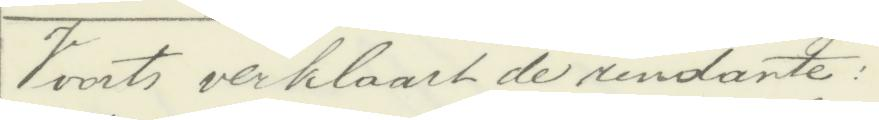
Voorts verklaart de rendante:
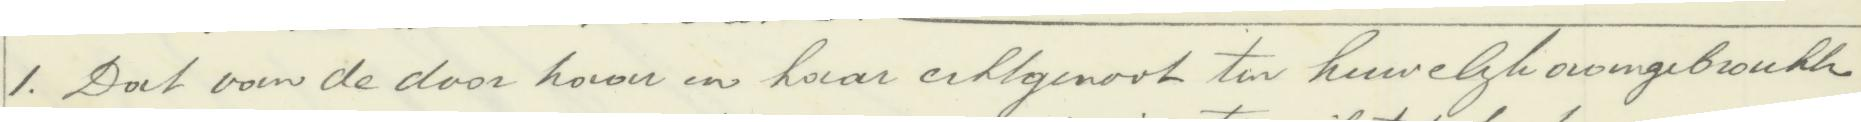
1. Dat van de door haar en haar echtgenoot ten huwelyk overgebrachte
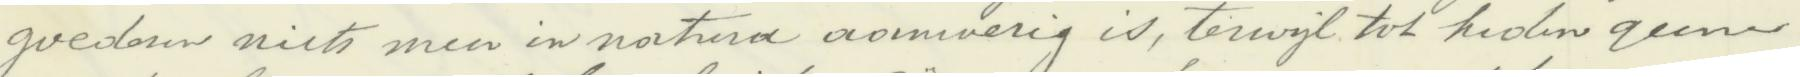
goederen niets meer in natura aanwezig is, terwijl tot heden geene
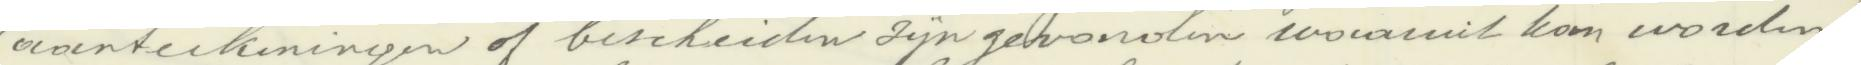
aanteekeningen of bescheiden zijn gevonden waaruit kan worden
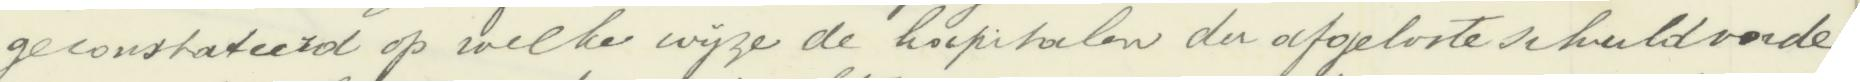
geconstateerd op welke wijze de kapitalen der afgeloste schuldvorde
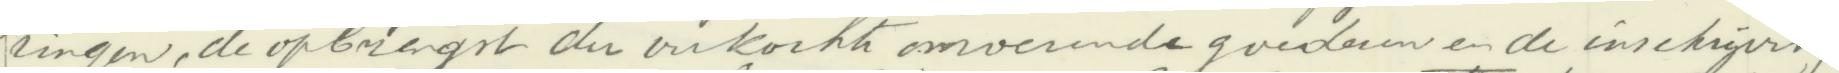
ringen, de opbrengst der verkochte onroerende goederen en de inschrijving
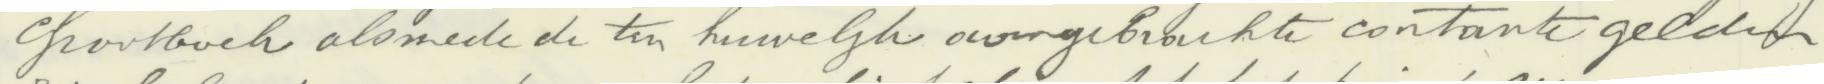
Gootboek alsmede de ten huwelyk ovorgebrachte contante gelden
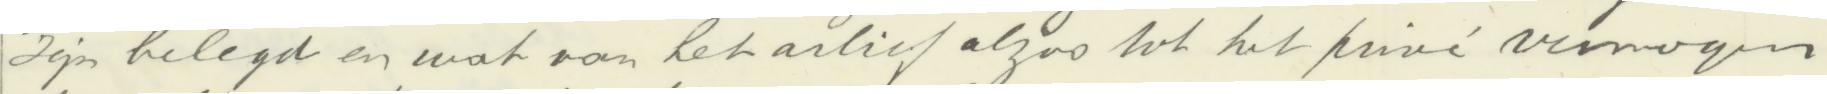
zijn belegd en wat van het actief alzoo tot het privé vermogen
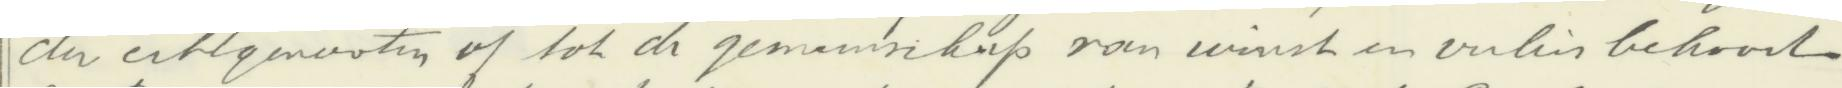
der echtgenooten of tot de gemeenschap van winst en verlies behoort
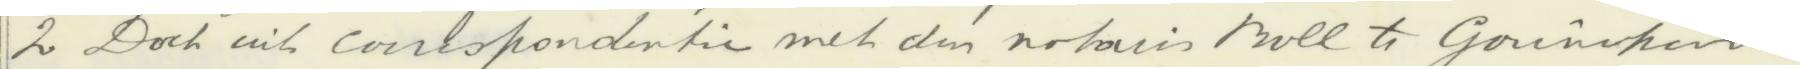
2. Doch uit correspondentie met den notaris Boll te Gorinchem
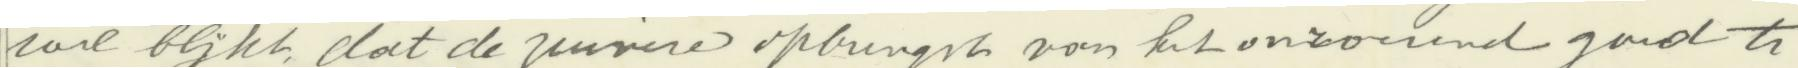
wel blijkt, dat de zuivere opbrengst van het onroerend goed te
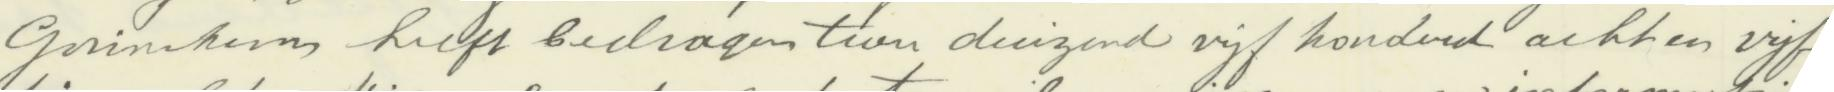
Gorinchem heeft bedragen tien duizend vijf honderd acht en vijf
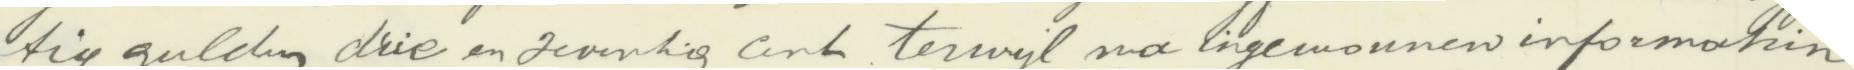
tig gulden drie en zeventig cent terwijl na ingewonnen informatien
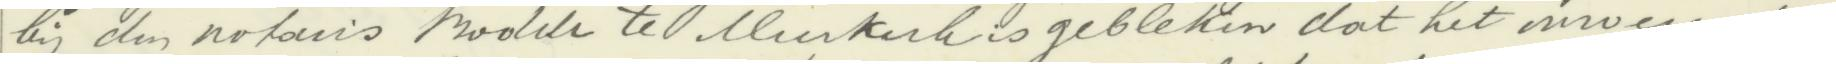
bij den notaris Bodde te Meerkerk is gebleken dat het onroerend
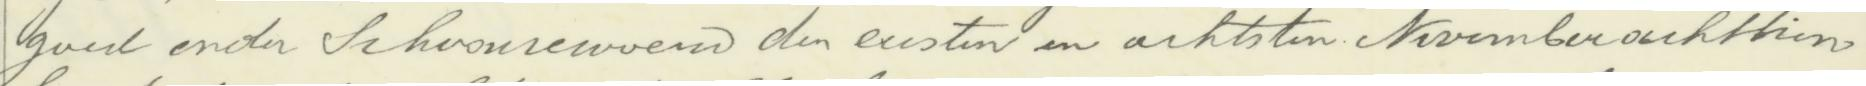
goed onder Schoonrewoerd den eersten en achtsten November achttien
